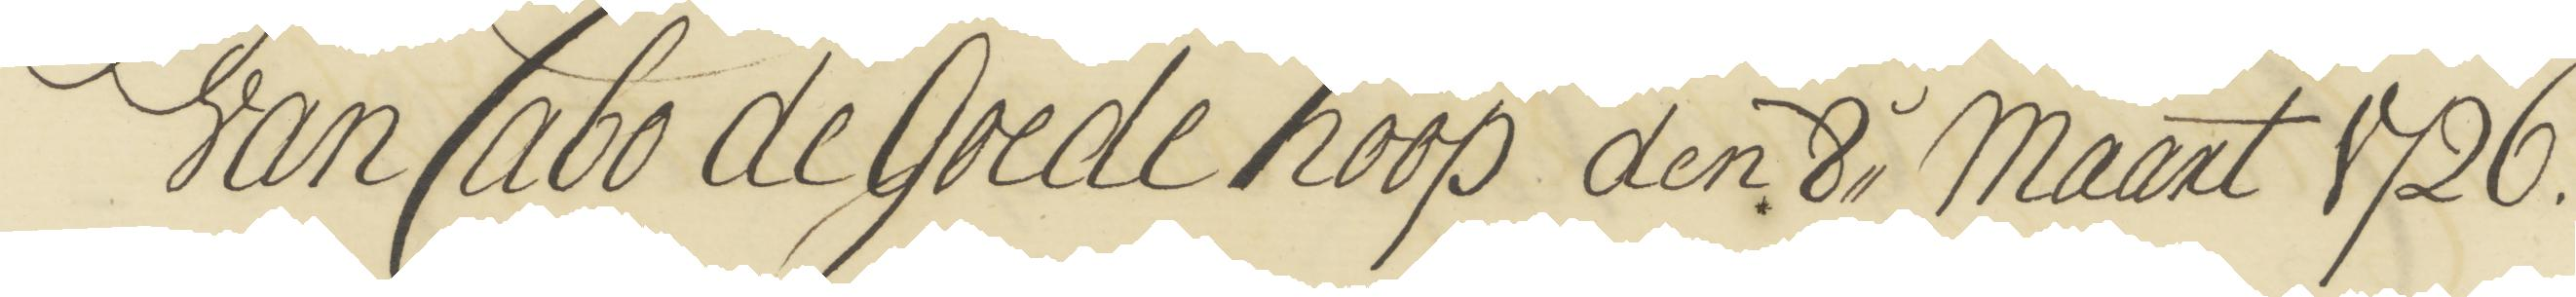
Van Cabo de Goede hoop den 8„' Maart 1726.
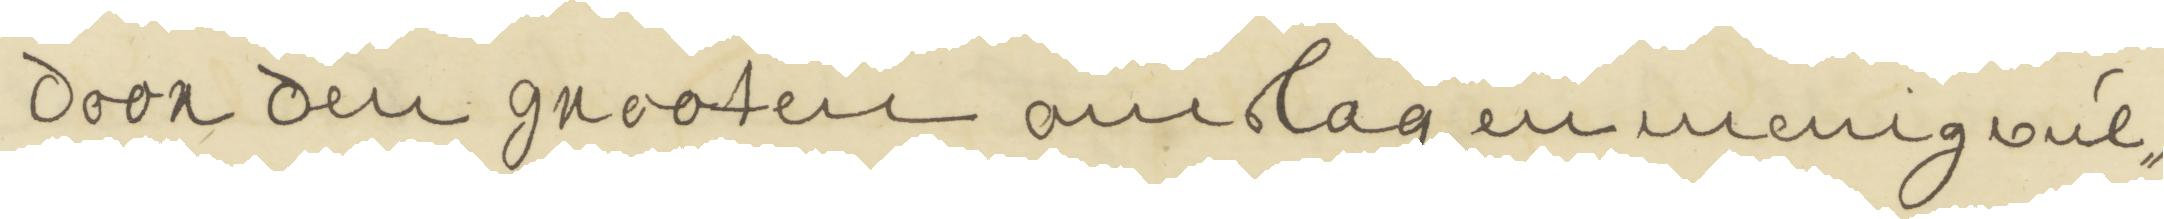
door den grooten omslag en menigvul„
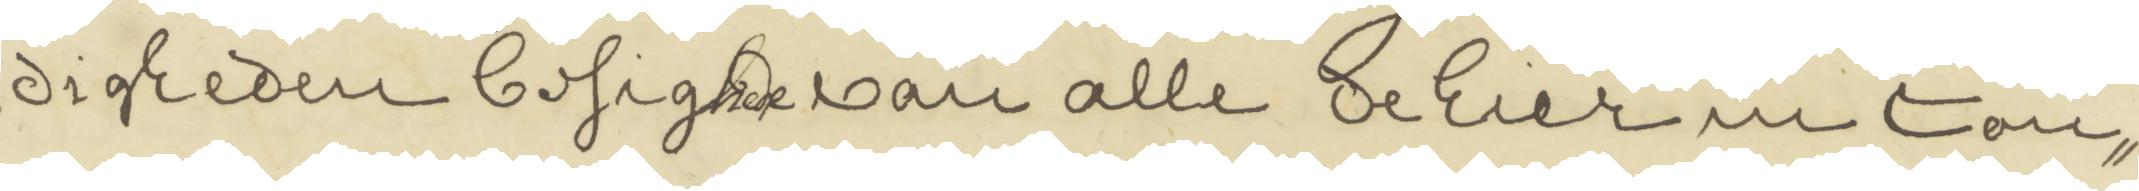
digheden besighede van alle de hier in con„
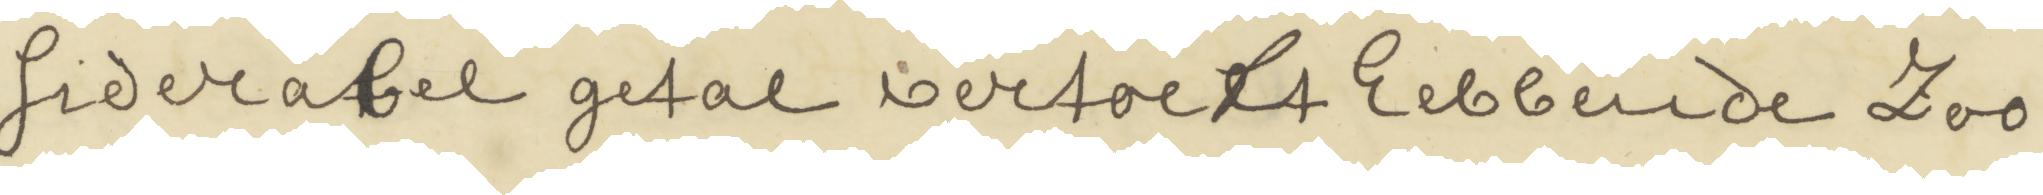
siderabel getal vertoeft hebbende zoo
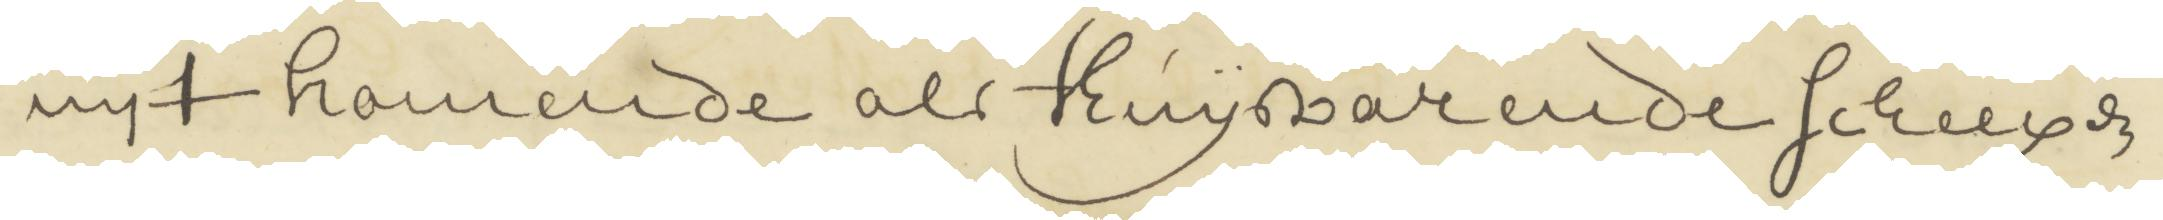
uijt komende als thuijsvarende scheepen
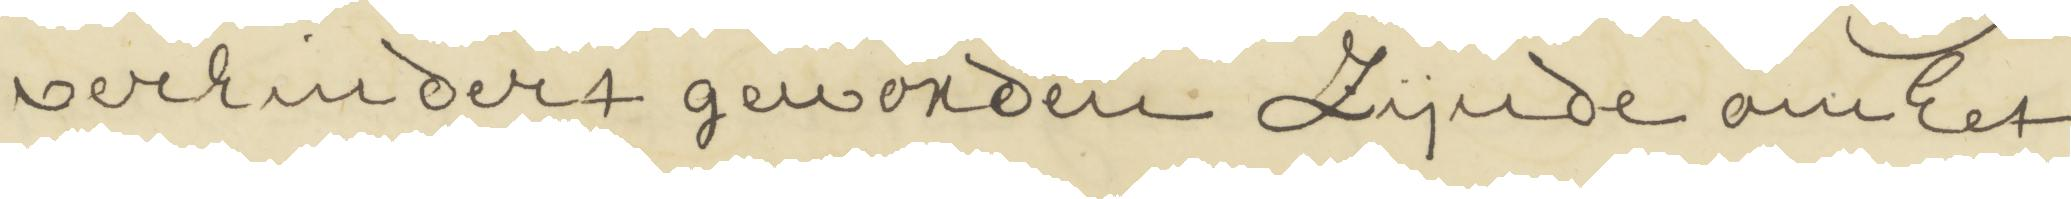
verhindert geworden zijnde om het
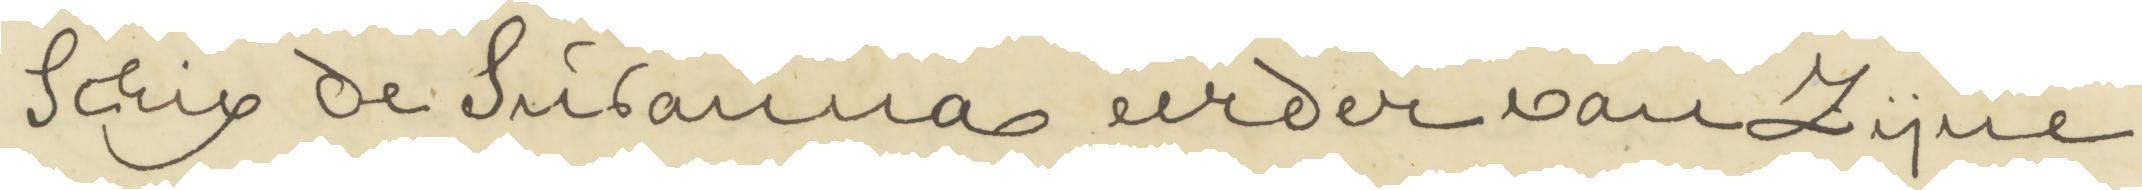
schip de susanna eerder van zijne
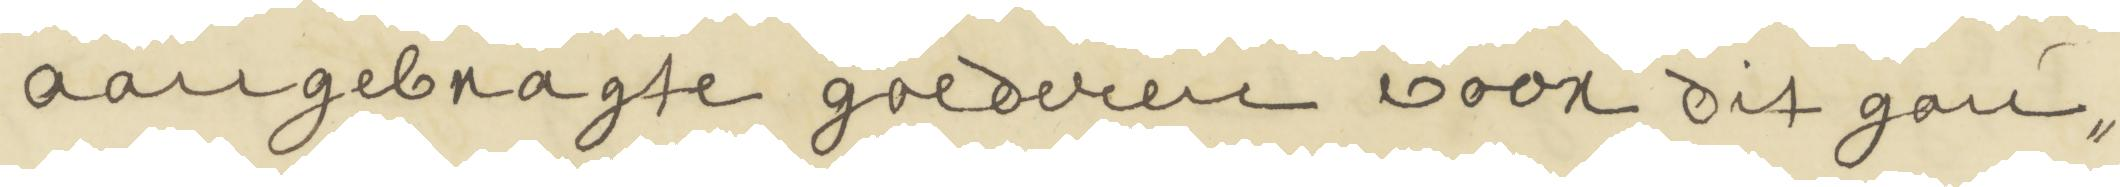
aangebragte goederen voor dit gou„
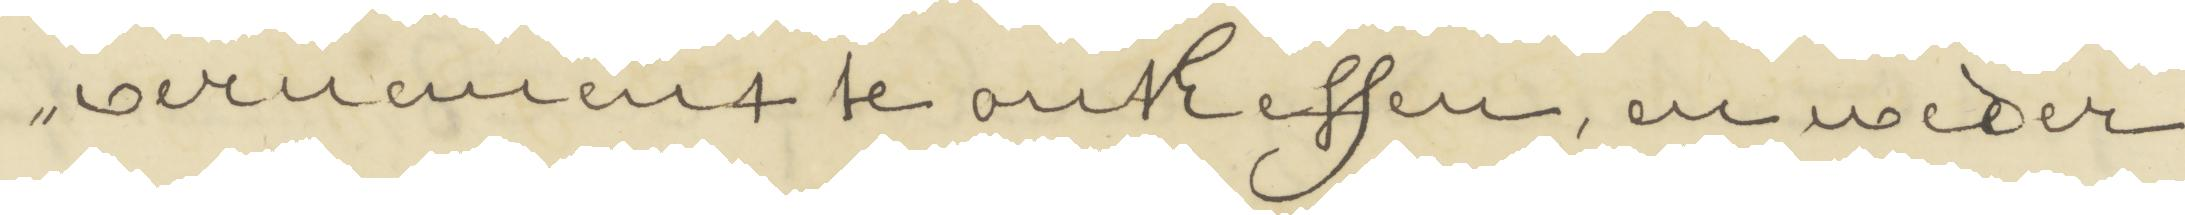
„vernement te ontheffen, en weder
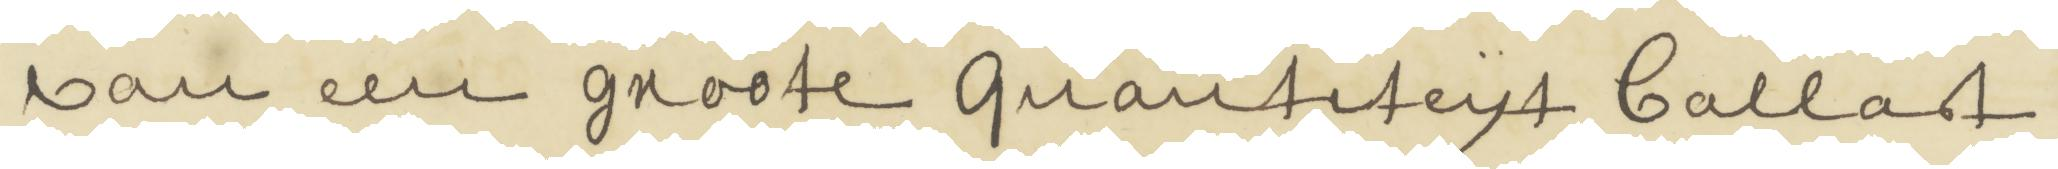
van een groote quantiteijt ballast
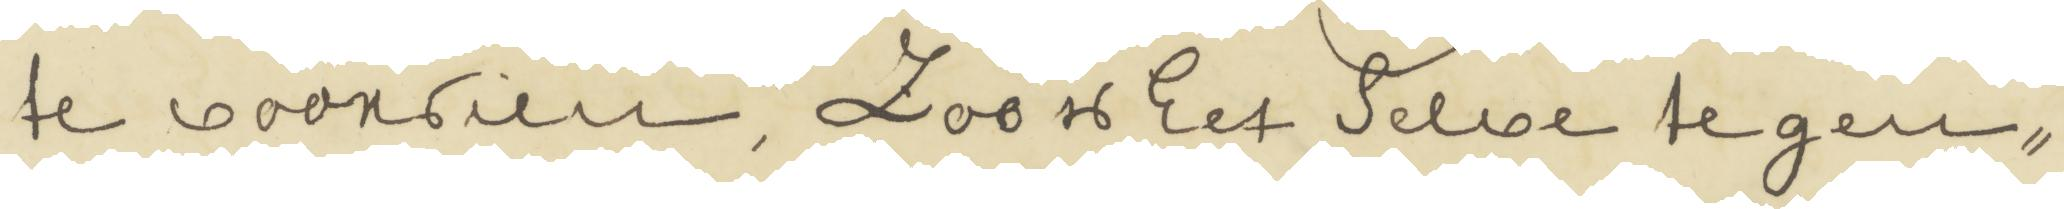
te voorsien, zoo is het selve tegen„
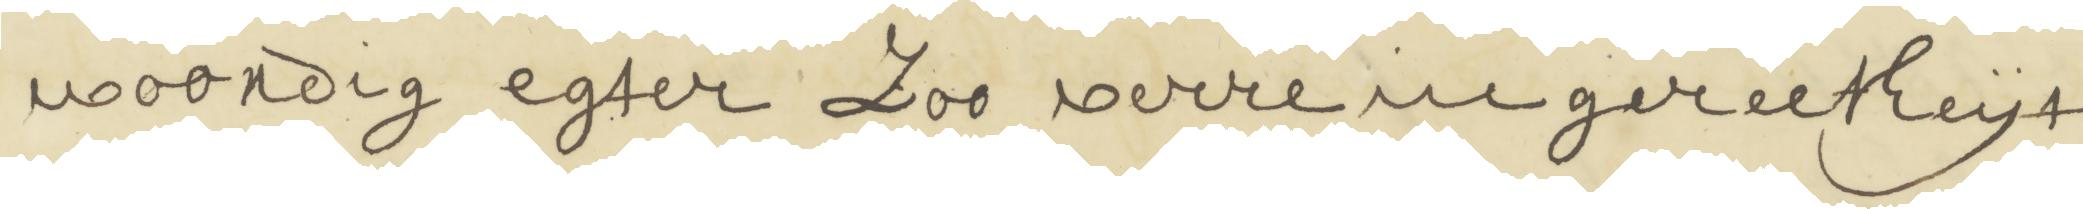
woordig egter zoo verre in gereetheijt
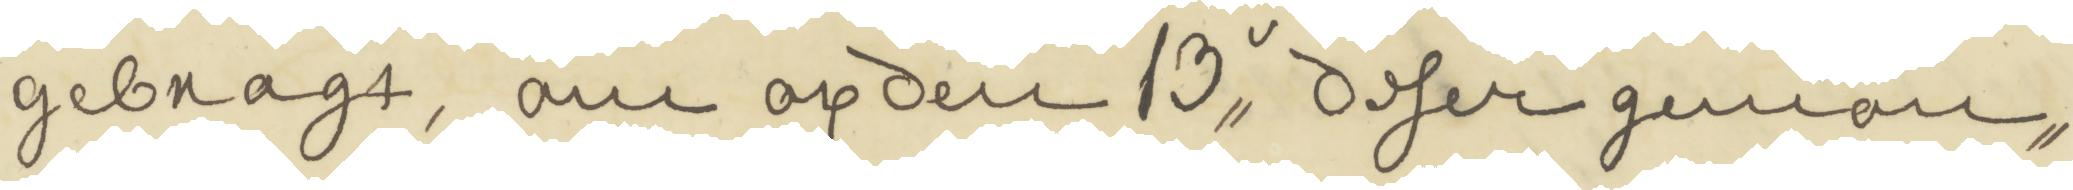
gebragt, om op den 13„' deser gemon„
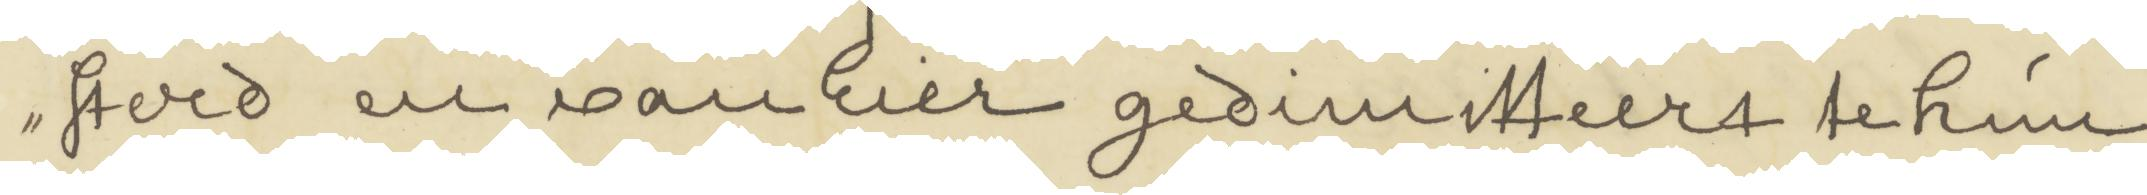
„sterd en van hier gedimitteert te hun
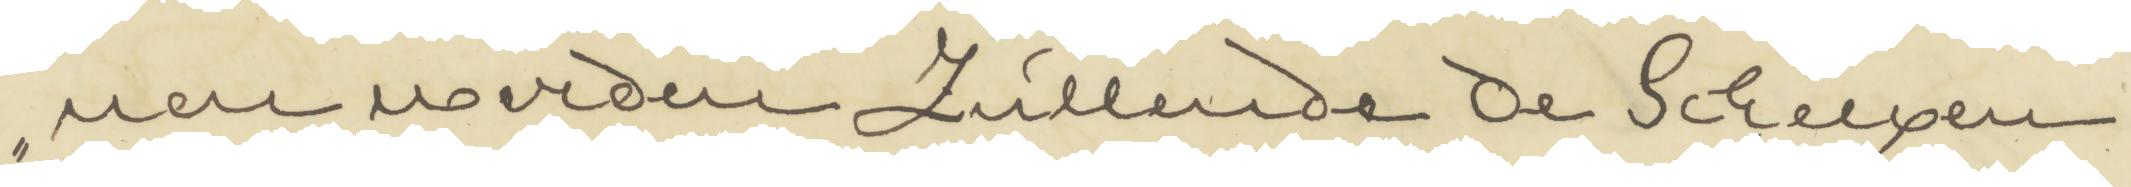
„nen werden zullende de scheepen
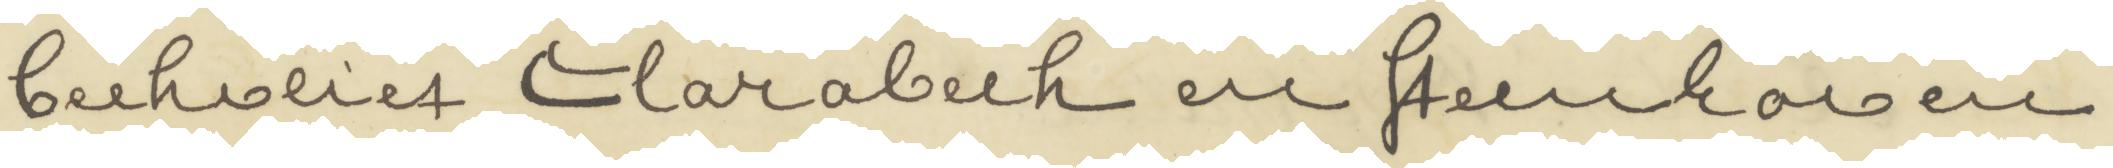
beekvliet, clarabeek en steenhoven
